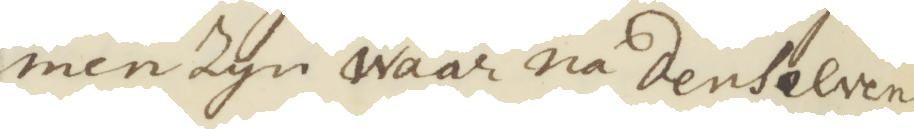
men zijn waar na denselven
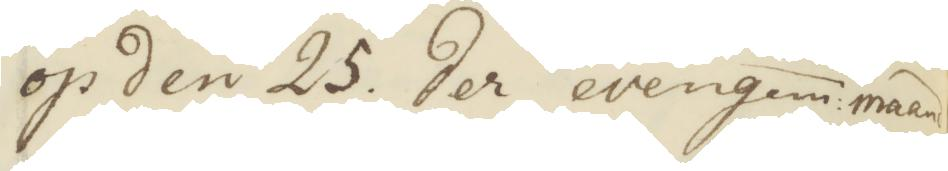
op den 25. der evengem: maand
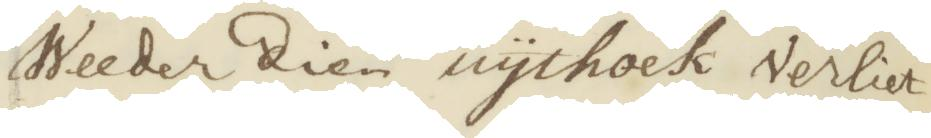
weeder dien uijthoek verliet
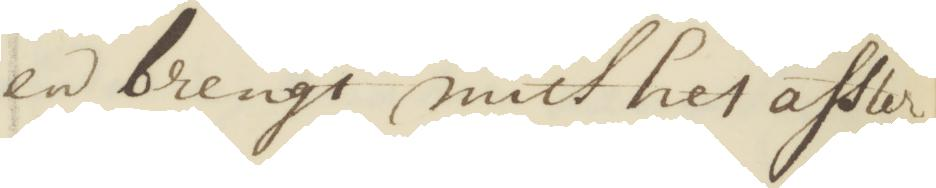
en brengt mits het afster
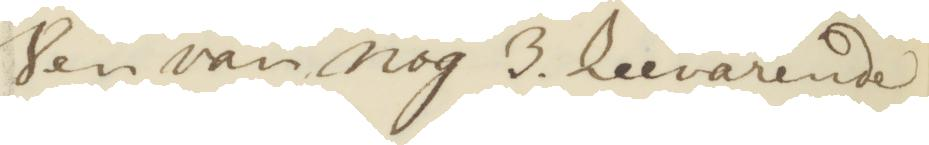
ven van nog 3. zeevarende
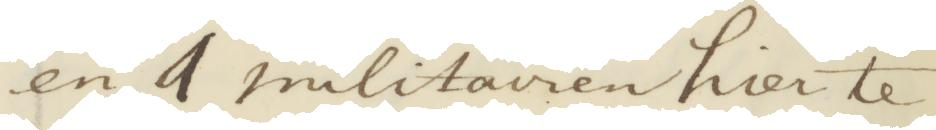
en 4 militairen hier te
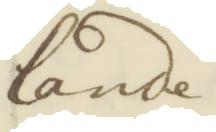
lande
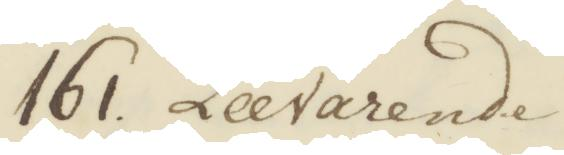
161. zeevarende
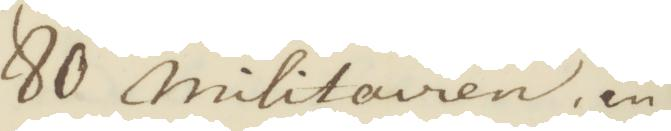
80 militairen, en
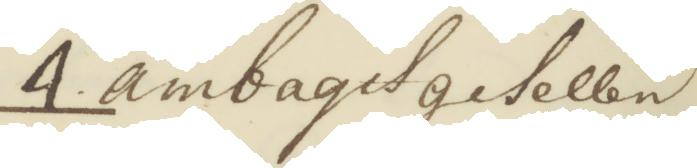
4. ambagts gesellen
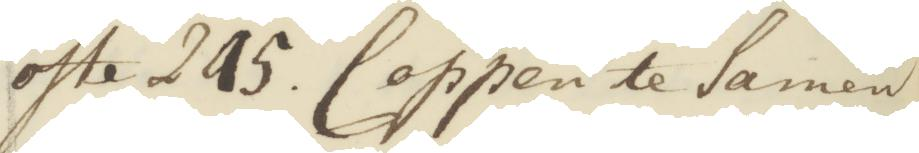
ofte 245. Coppen te samen
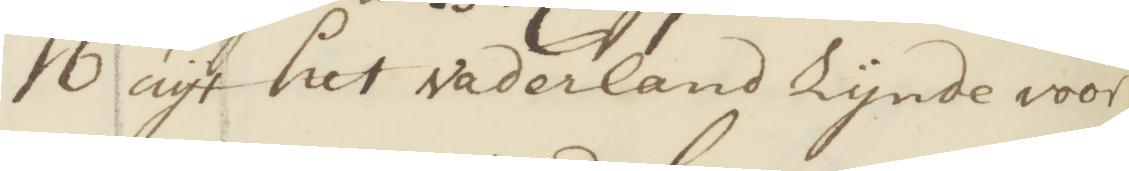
16 uijt het vaderland zijnde voor
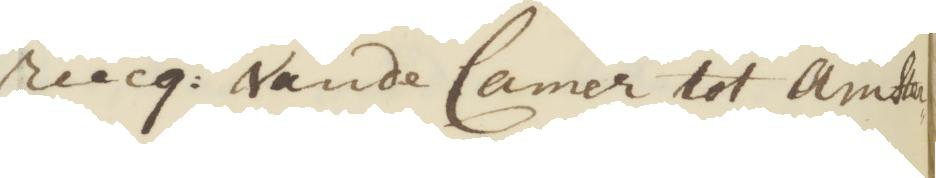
reecq: vande Camer tot Amster„
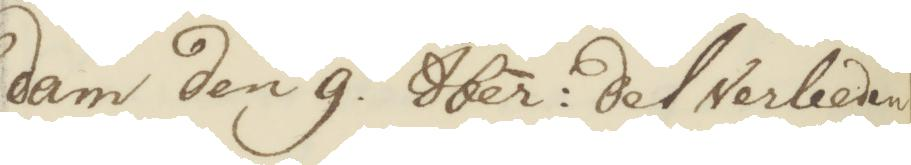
dam den 9.' 8ber: des verleeden
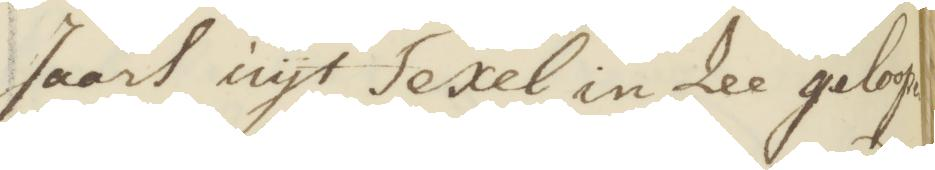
Jaars uijt Texel in zee geloope
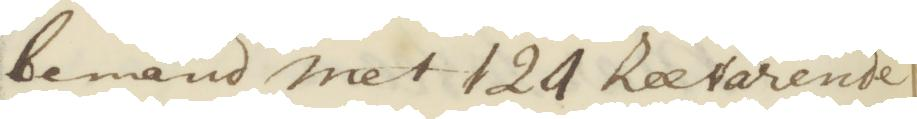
bemand met 124 zeevarende
